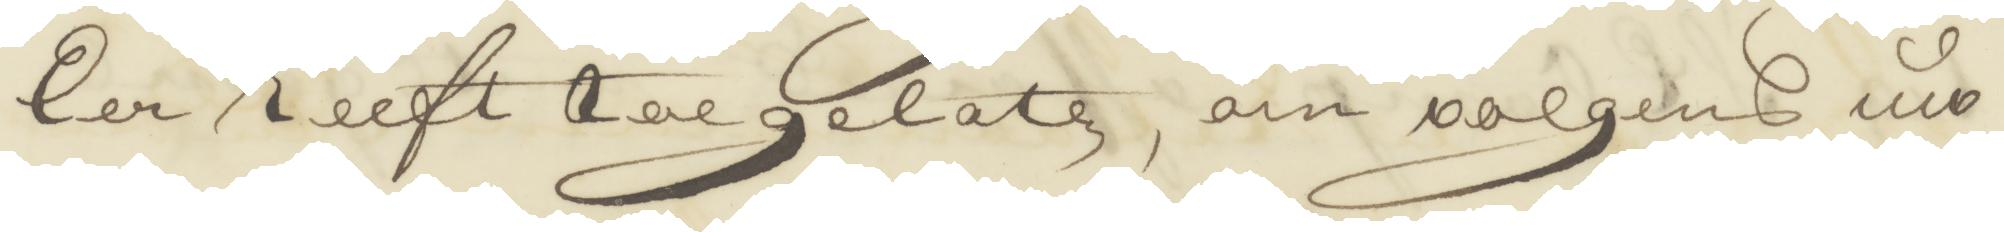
Eer heeft toe gelaten, om volgens uw
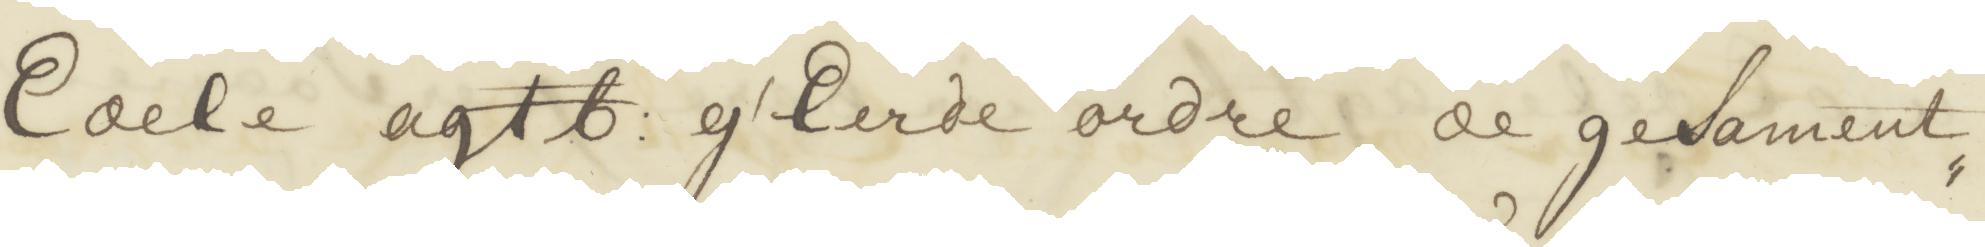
Edele agtb: g’ Eerde ordre, de gesament„
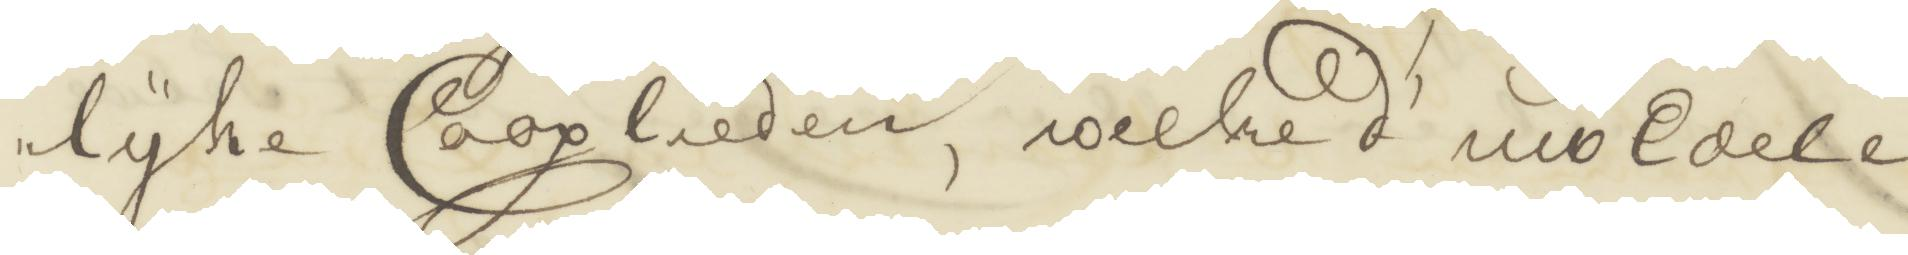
„lijke Cooplieden, welke d’ uw Edele
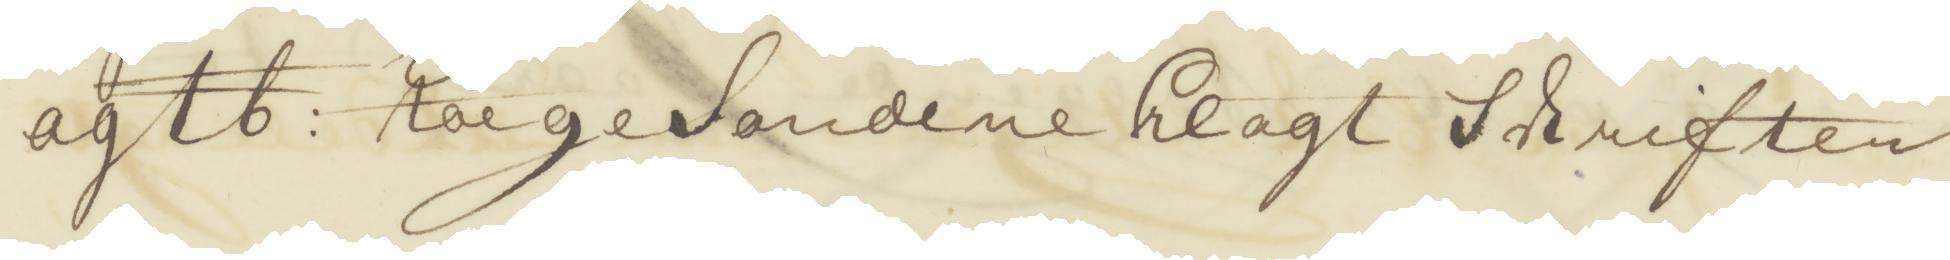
agtb: toe gesondene klagt schriften
